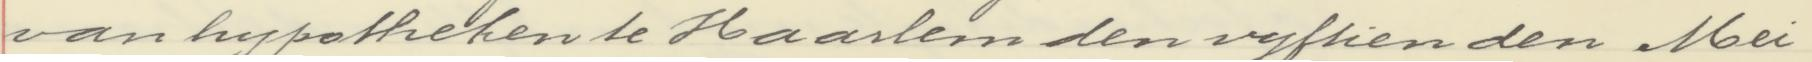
van hypotheken te Haarlem den vyftienden Mei
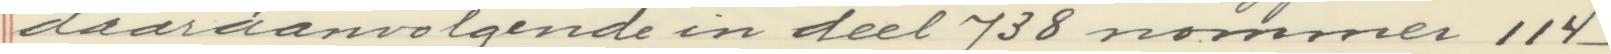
daaraanvolgende in deel 738 nommer 114
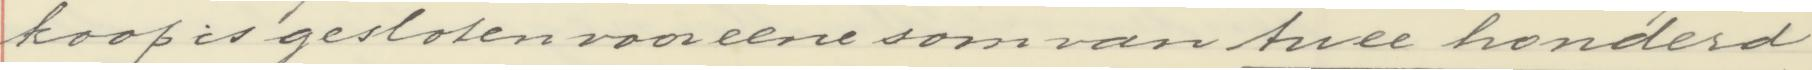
koop is gesloten voor eene som van twee honderd
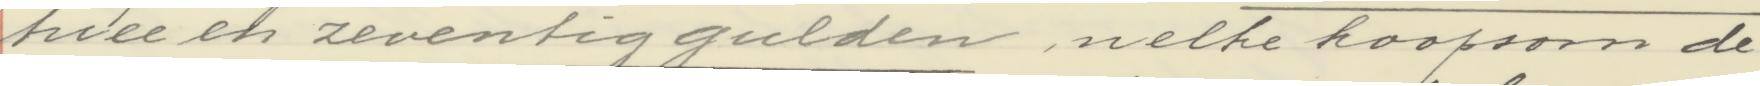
twee en zeventig gulden, welke koopsom de
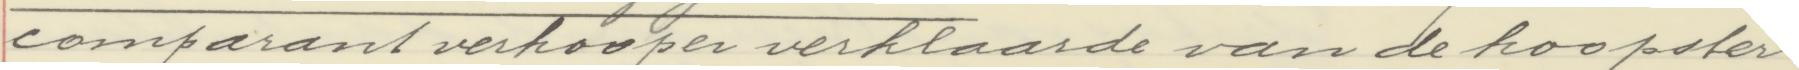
comparant verkooper verklaarde van de koopster
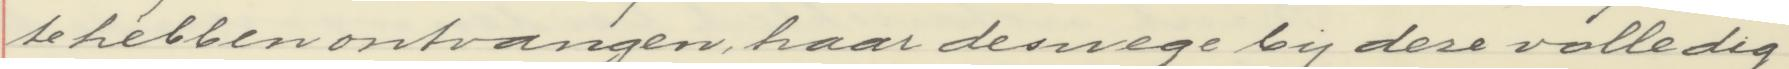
te hebben ontvangen, haar deswege bij deze volledig
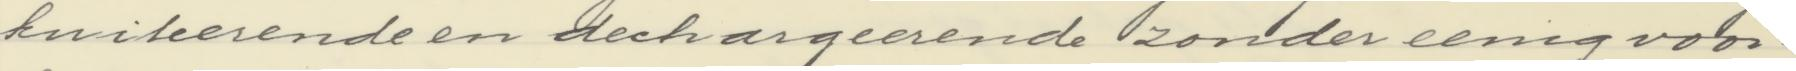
kwiteerende en dechargeerende zonder eenig voor
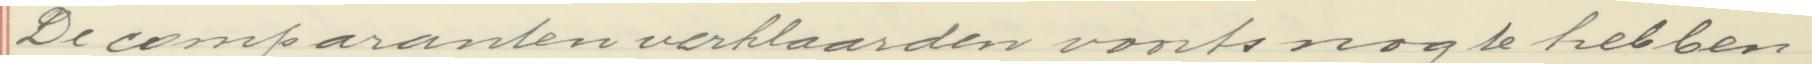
De comparanten verklaarden voorts nog te hebben
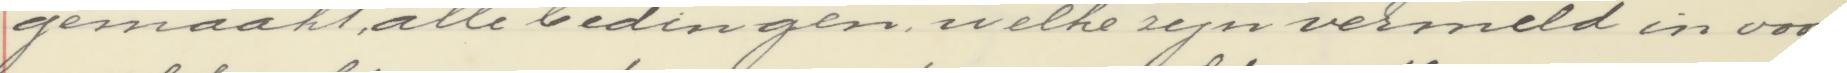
gemaakt, alle bedingen, welke zyn vermeld in voor
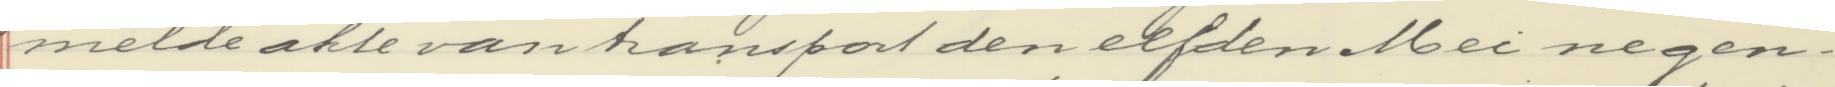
melde akte van transport den elfden Mei negen
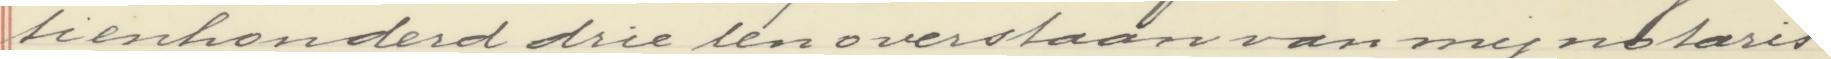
tienhonderd drie ten overstaan van my notaris
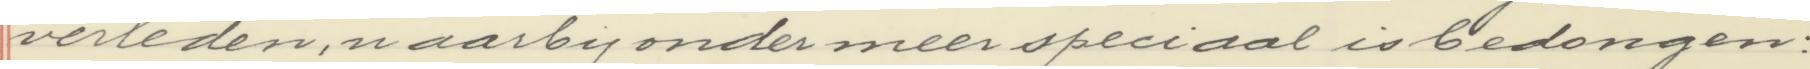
verleden, waarby onder meer speciaal is bedongen
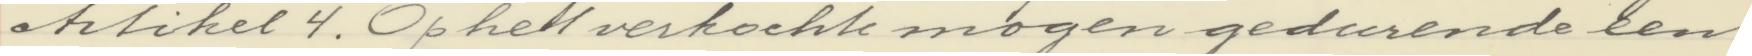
Artikel 4. Op het verkochte mogen gedurende een
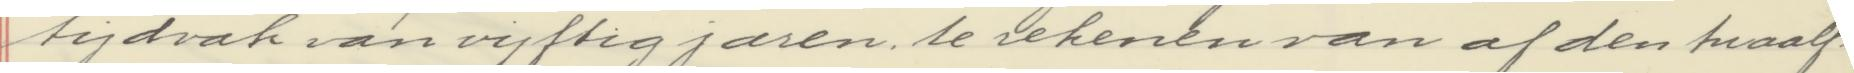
tijdvak van vijftig jaren, te rekenen van af den twaalf
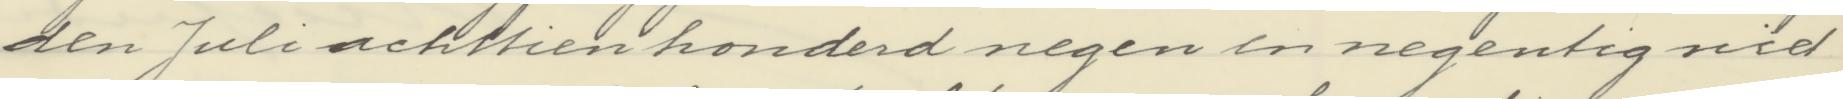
den Juli achttien honderd negen en negentig niet
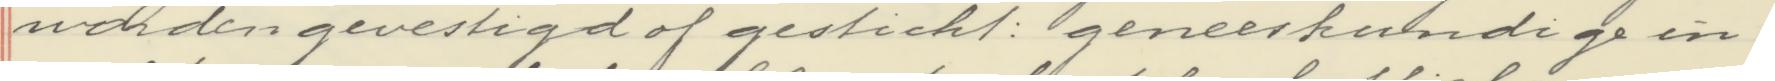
worden gevestigd of gesticht: geneeskundige in-
